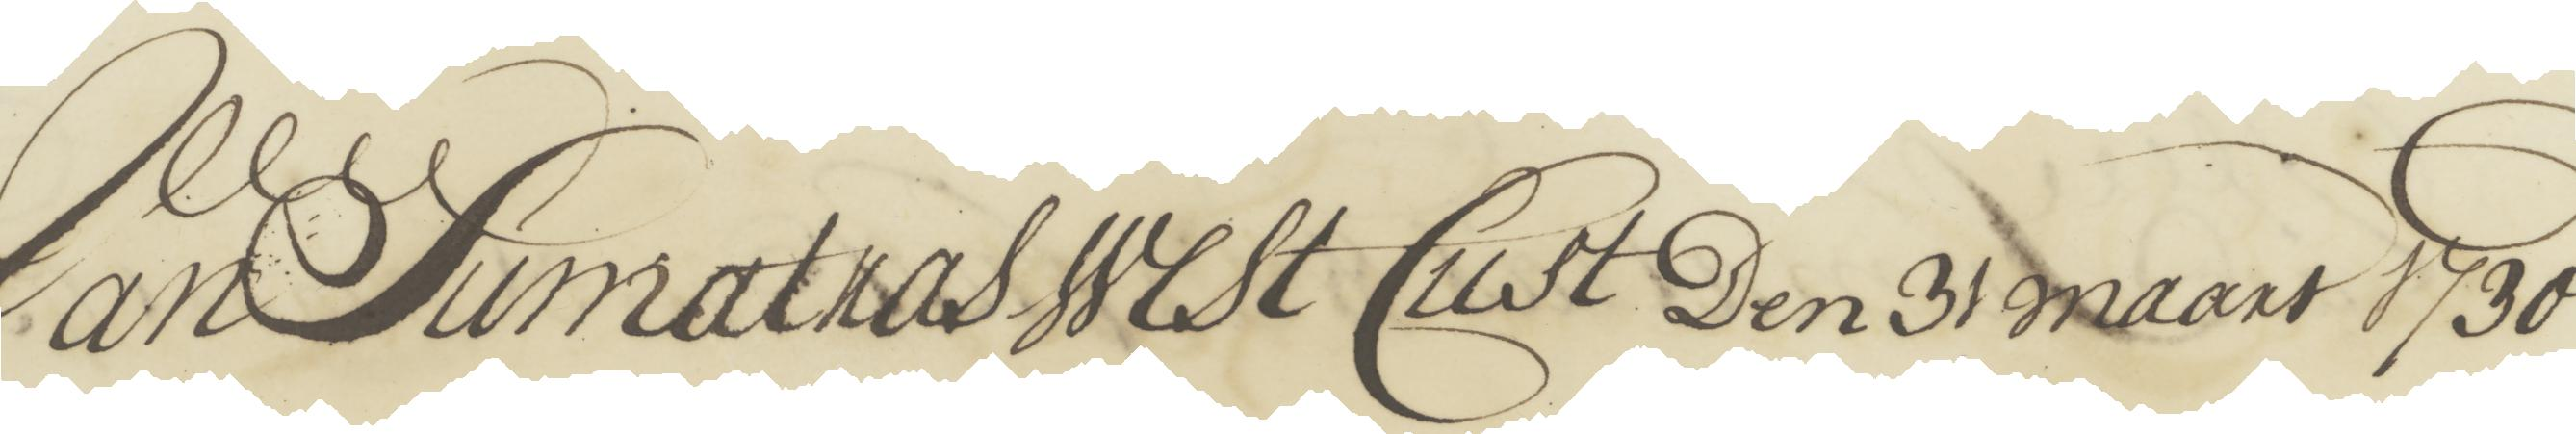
Van Sumatras west Cust Den 31 maart 1730
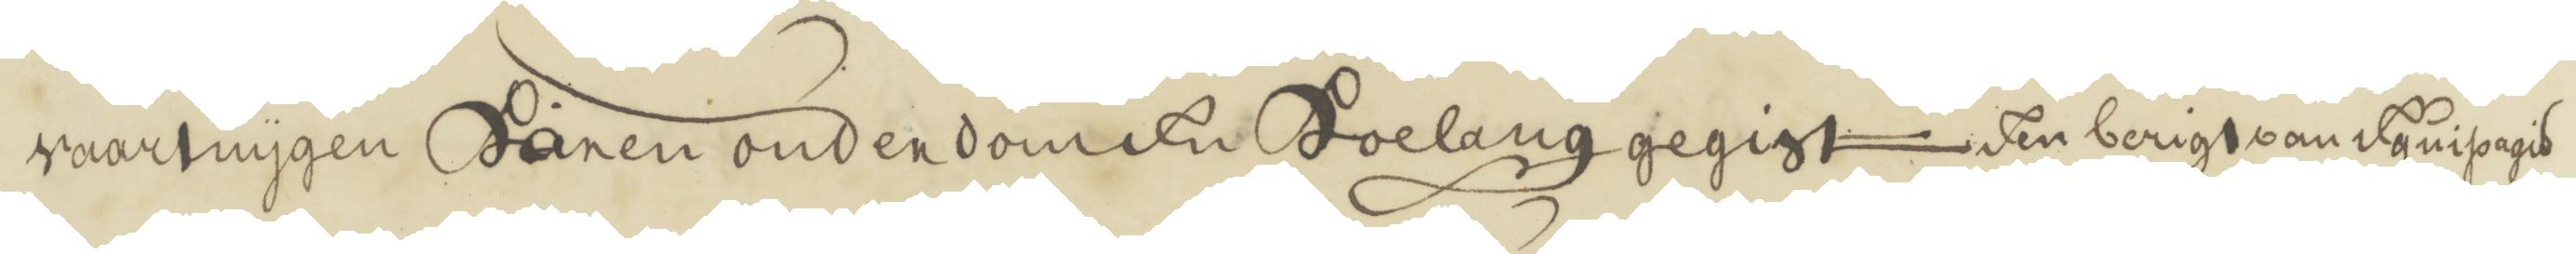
vaartuijgen haren ouderdom en hoelang gegist een berigt van equipagie
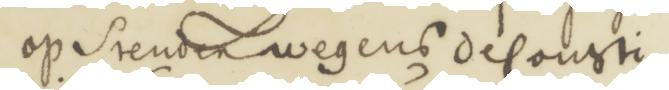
opsiender wegens de consti
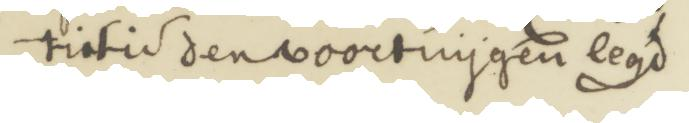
tutie der voortuijgen legd
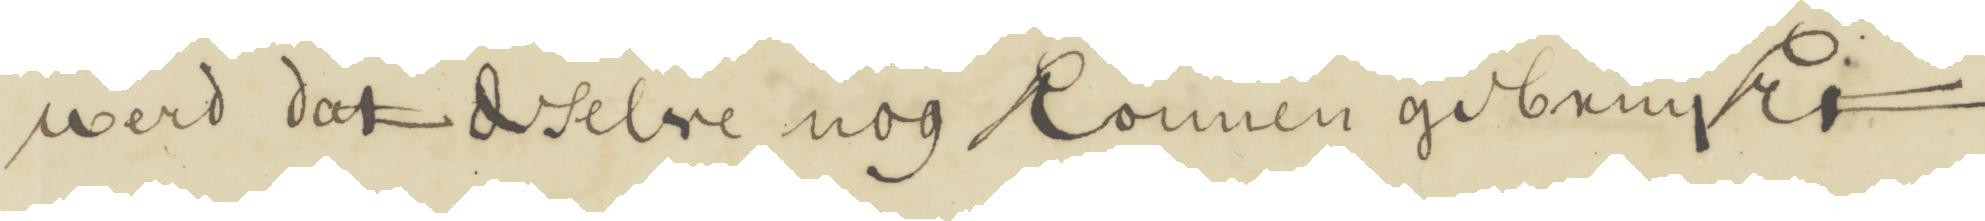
werd dat deselve nog konnen gebruijkt
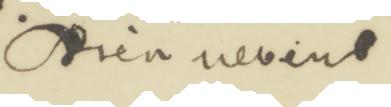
hier nevens
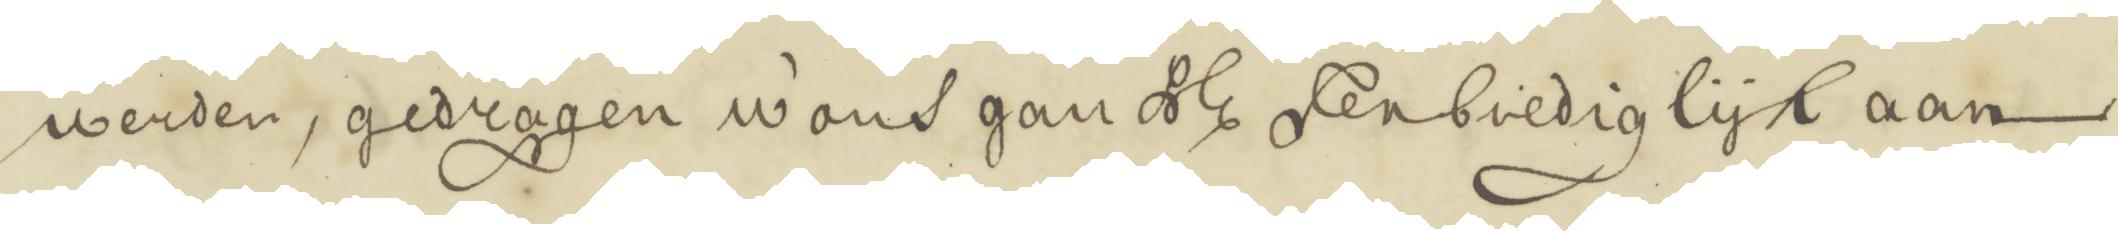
werden, gedragen w'ons gansch eerbiediglijk aan
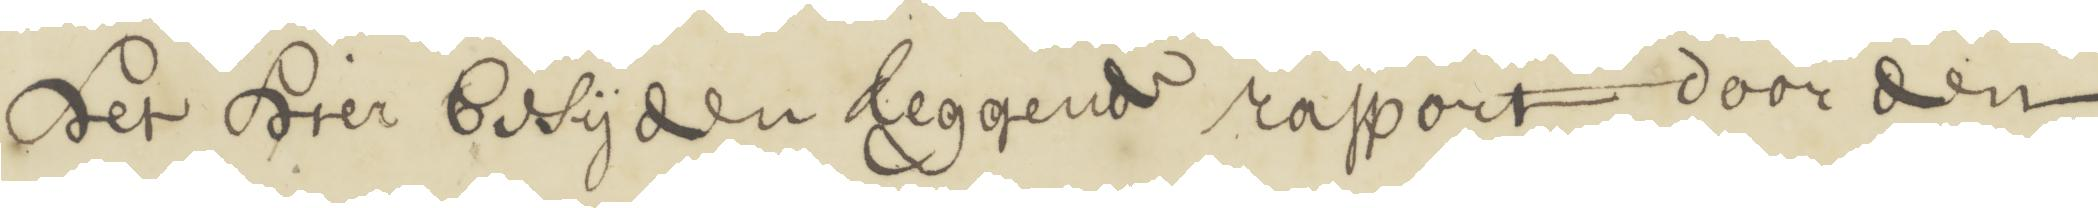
het hier besijden leggende rapport door den
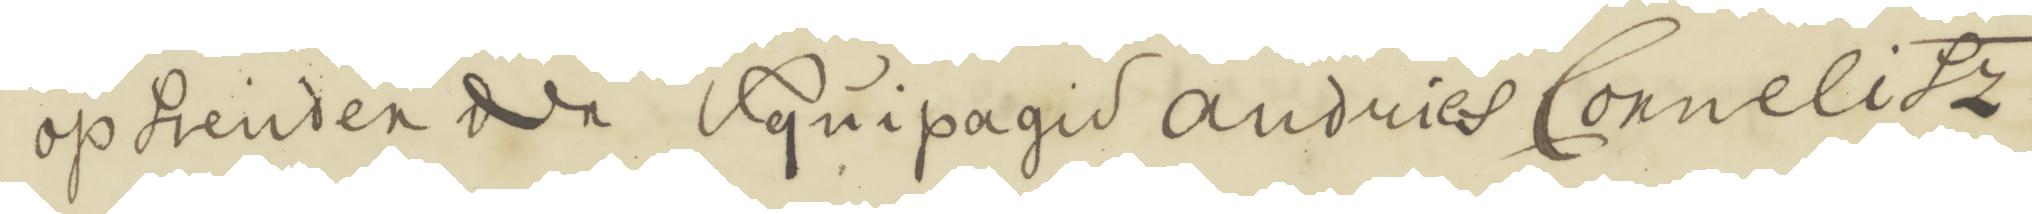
opsiender der equipagie andries Cornelisz,
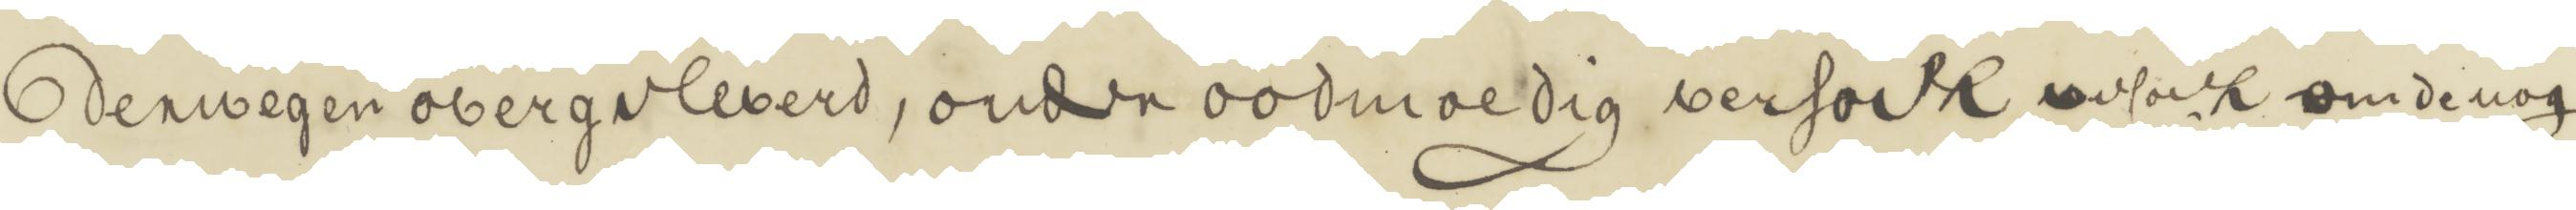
derwegen overgeleverd, onder oodmoedig versoek versoek om de nog
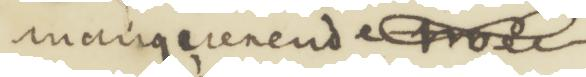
manquerende moe
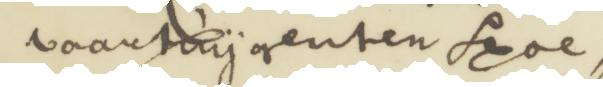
vaartuijgen ten spoe„
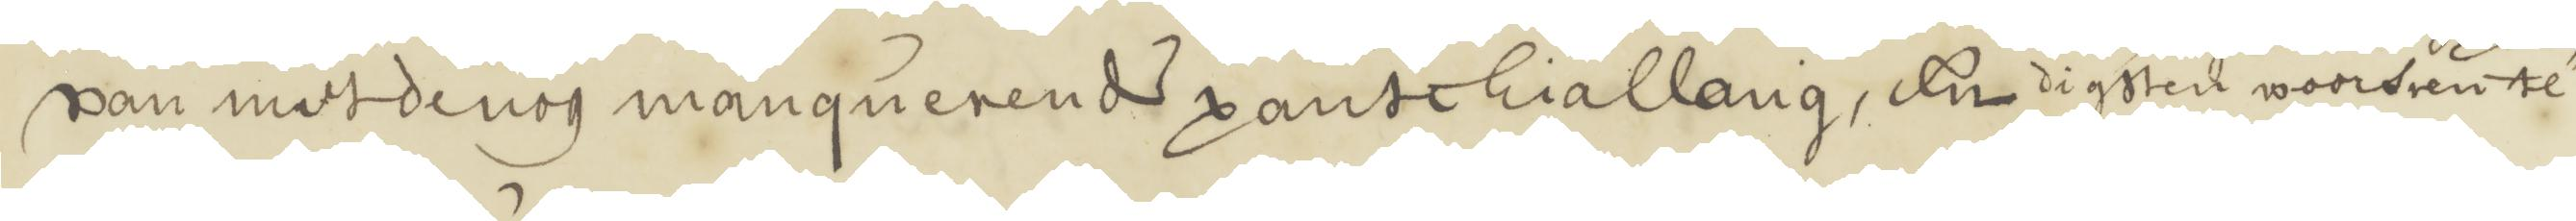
van met de nog manquerende pantchiallang, en digsten voorsien te
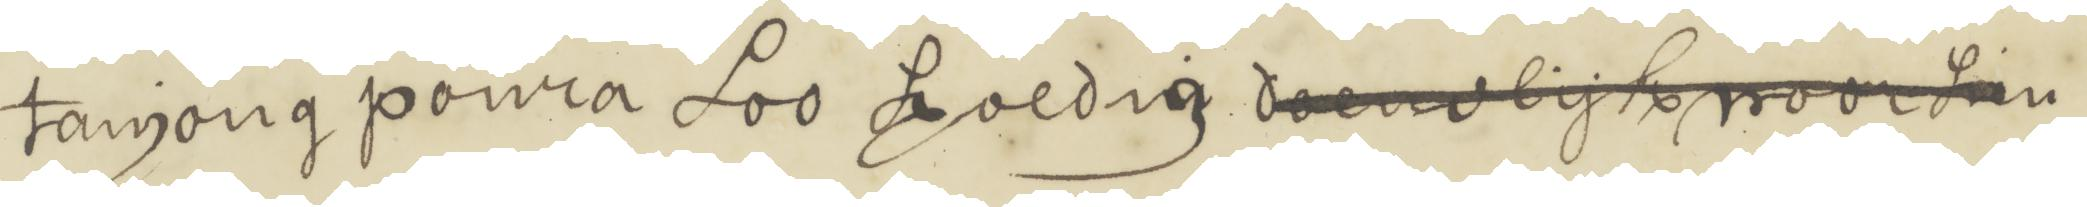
tanjong poura soo spoedig doenlijk woorden
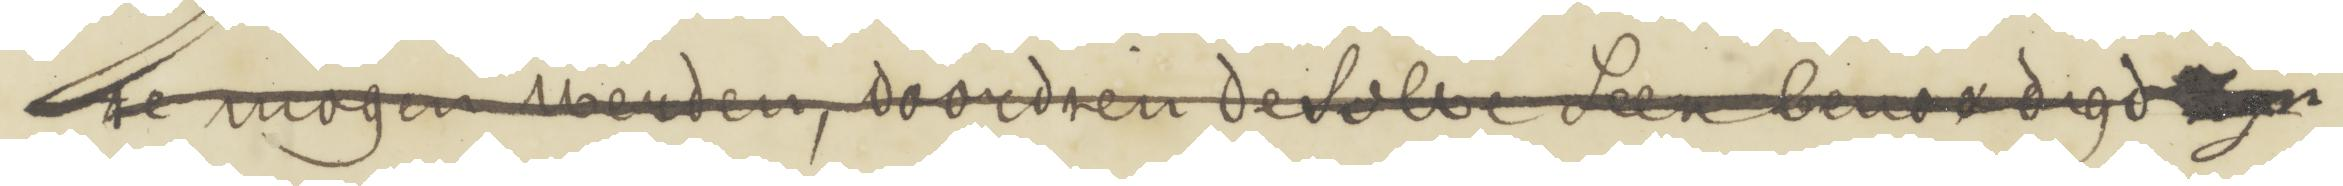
te mogen werden, doordien deselve seer benoodigd zyn
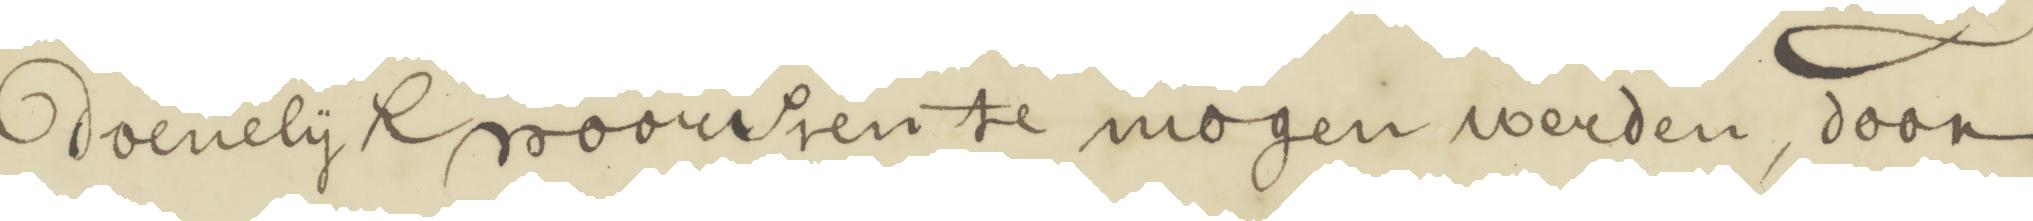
doenelijk voorsien te mogen werden, door
